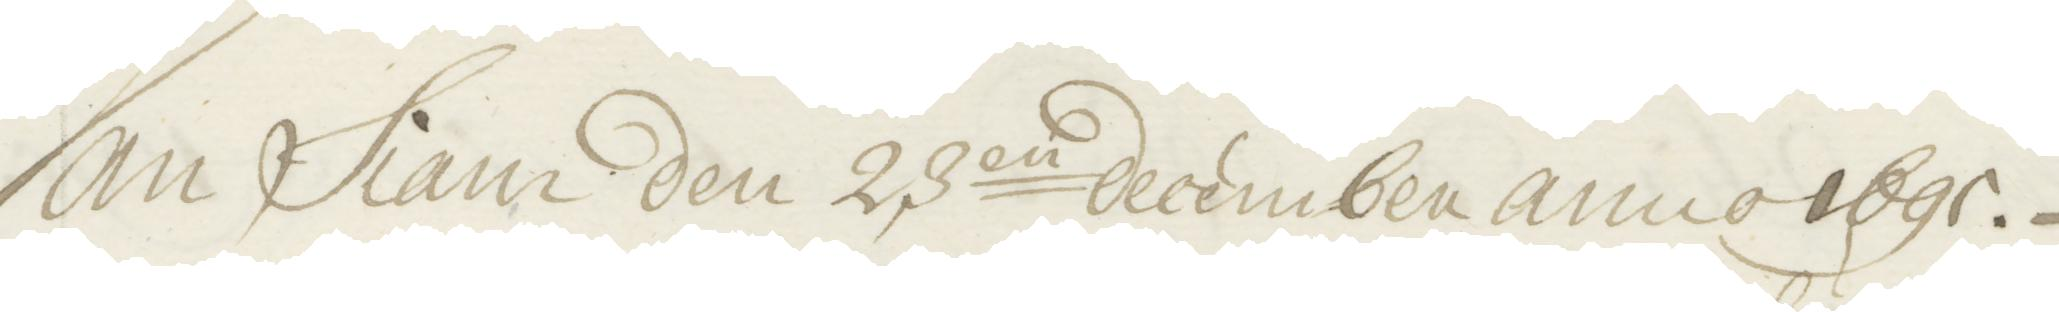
Van Siam den 23=en december anno 1695. –
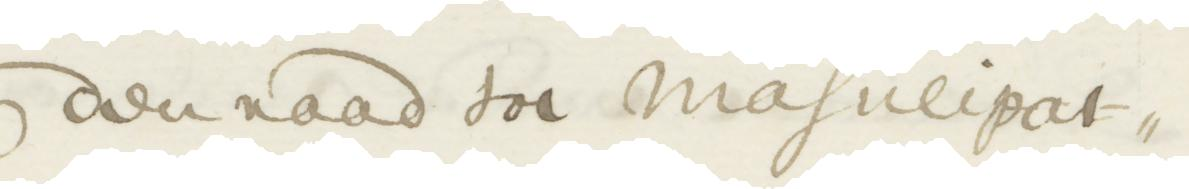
den raad tot masulipat„
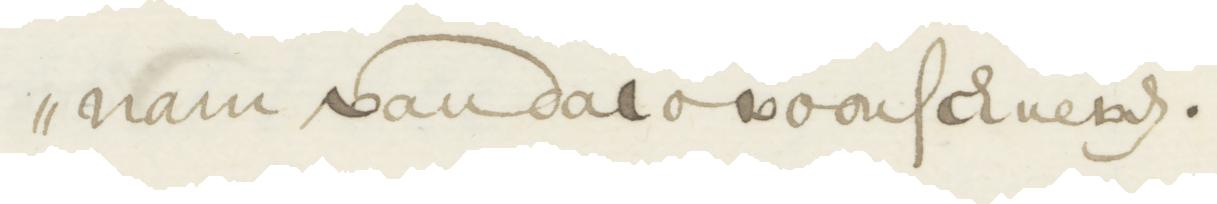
„nam van dato voorschreven.
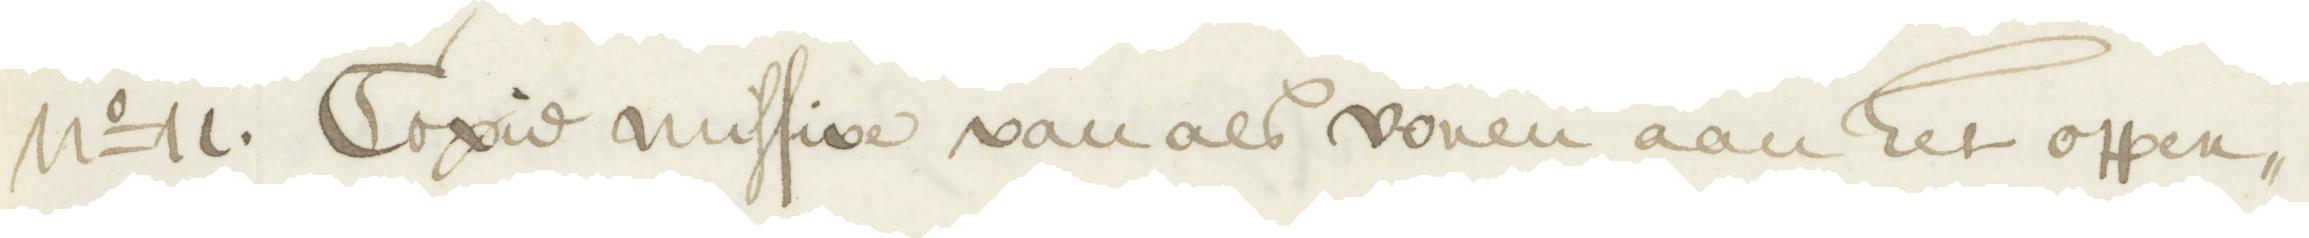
n=o 11. Copie missive van als voren aan het opper„
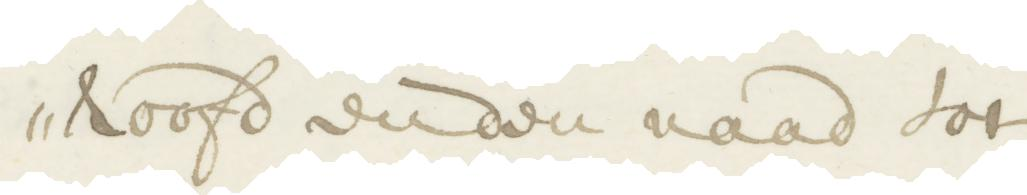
„hoofd en den raad tot
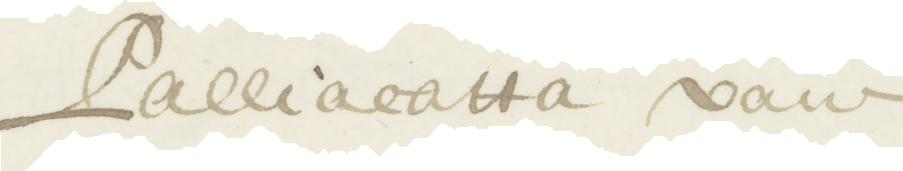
Palliacatta van
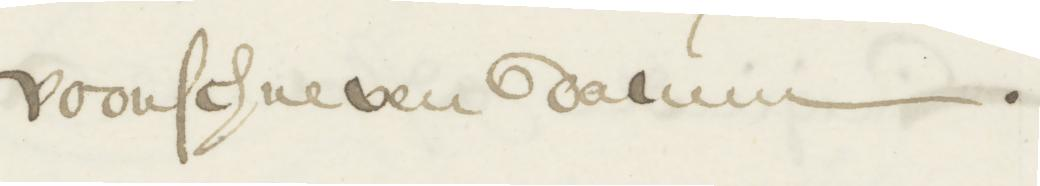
voorschreven datum .
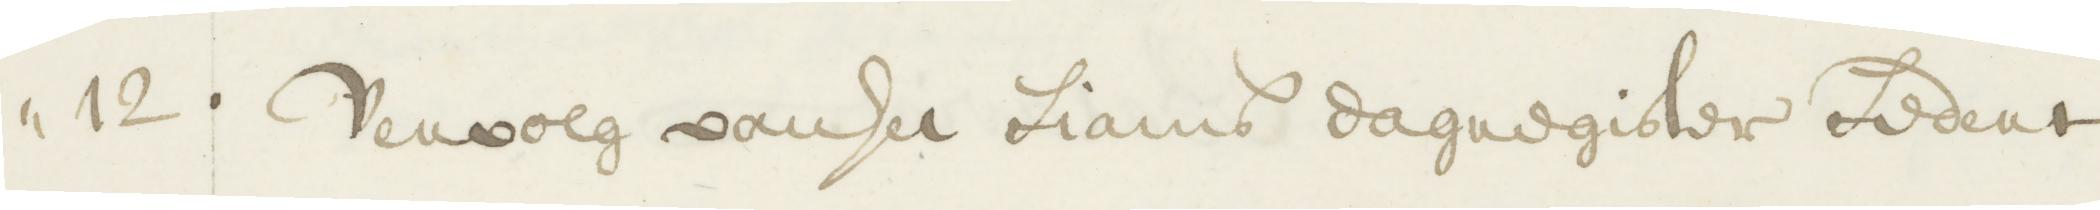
„ 12. Vervolg van het siams dagregister sedert
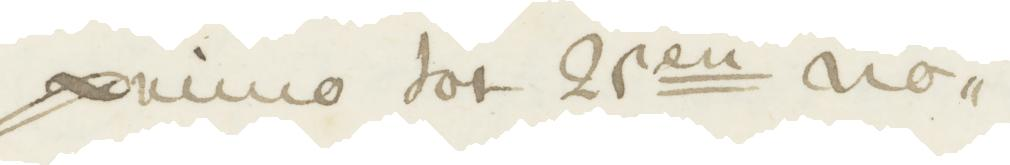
primo tot 25=en no„
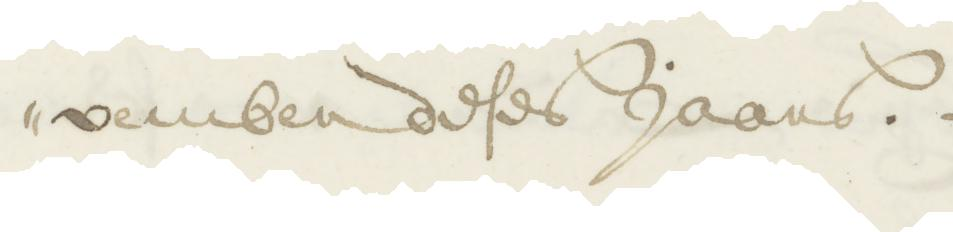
„vember deses jaars.
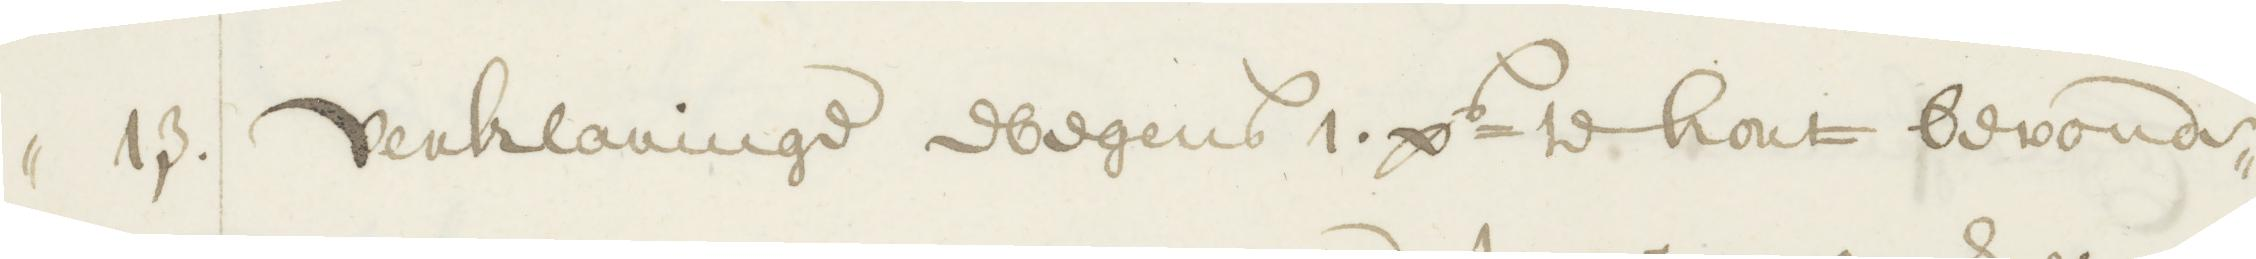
„ 13. verklaringe wegens 1. p=s te kort bevonde„
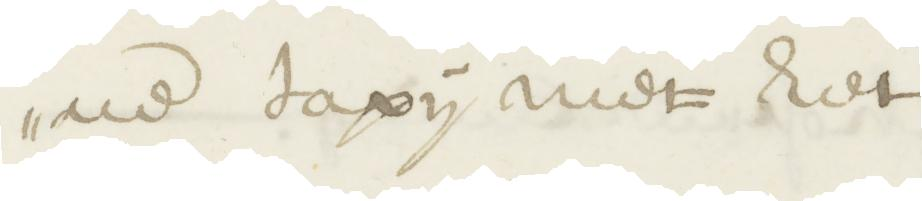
„ne tapij met het
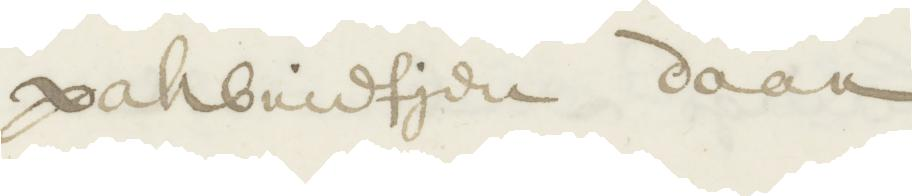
pakbriefjen daar
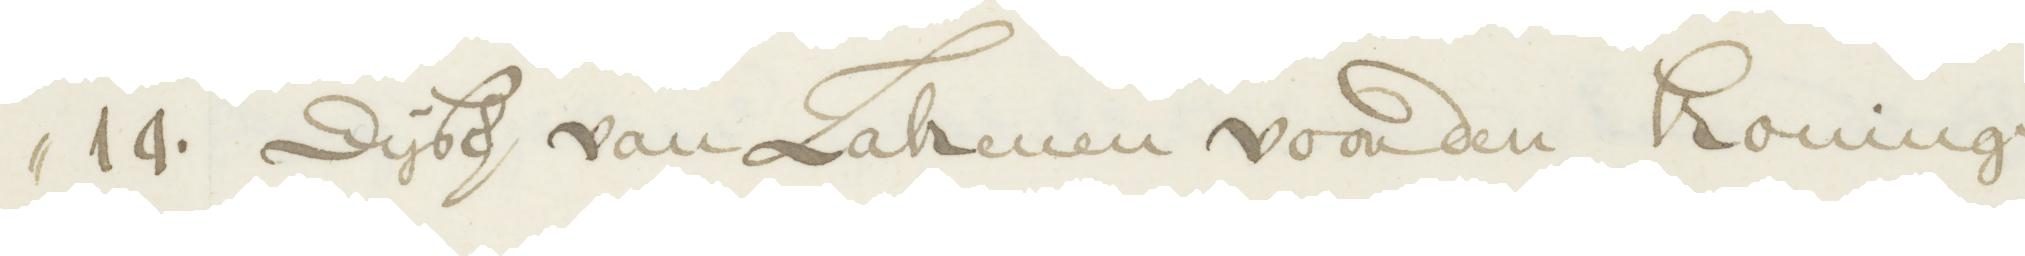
„ 14. Eijsch van Zakenen voor den koning
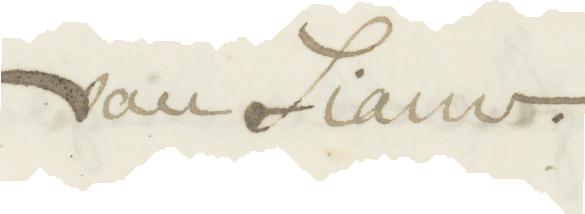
van Siam.
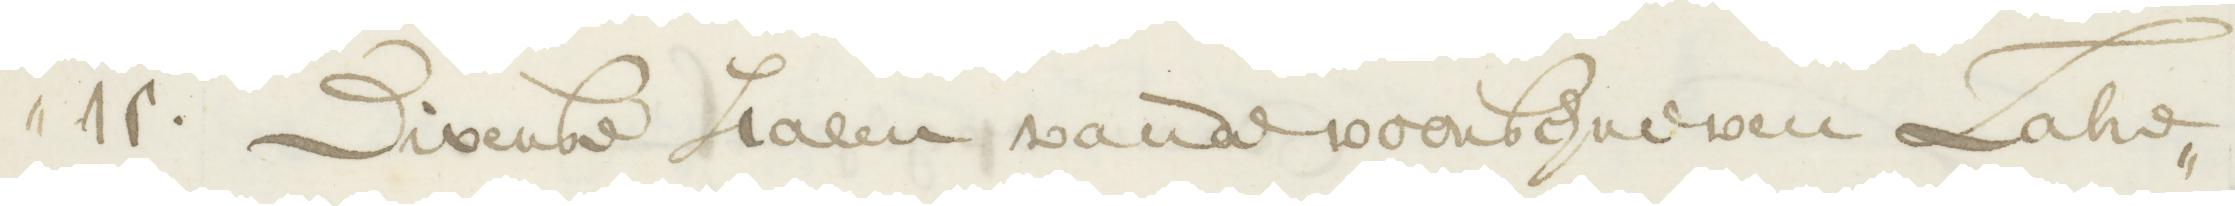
„ 15. Diverse stalen vande voorschreven Zake„
